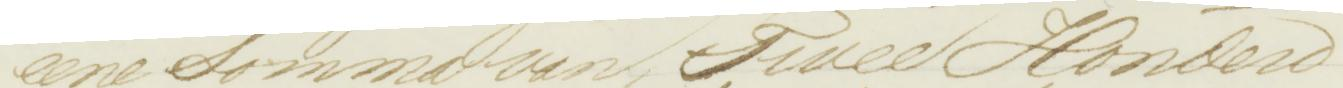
eene somma van Twee Honderd
